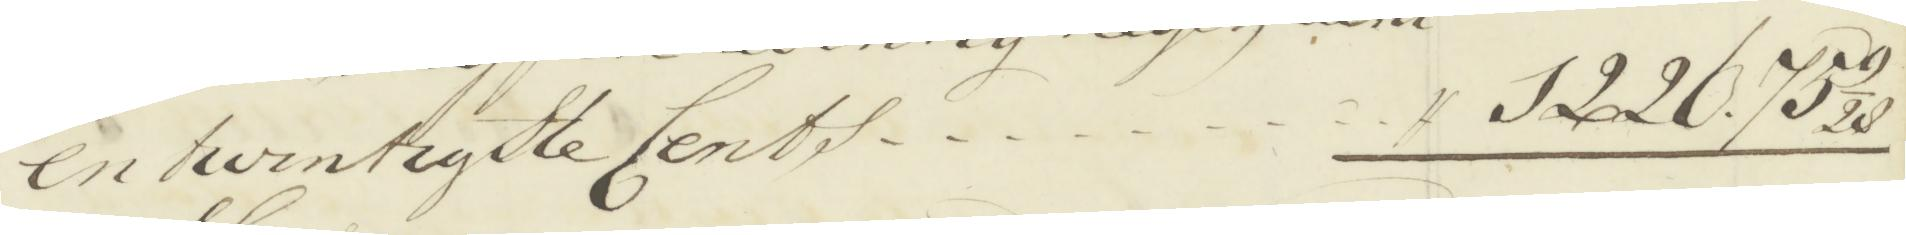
en twintigste Cents . . . . . . . . . „ 1226.75 9/28
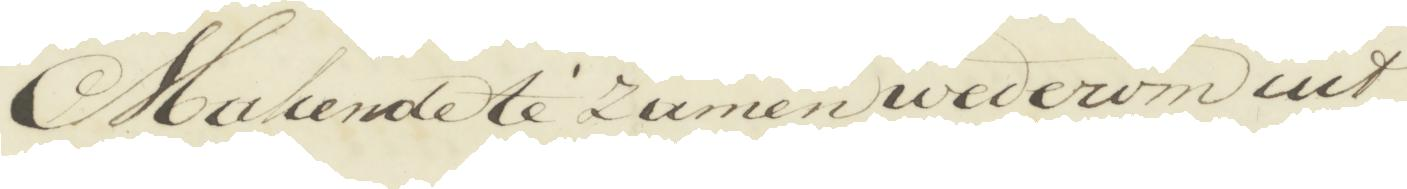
Makende te zamen wederom uit
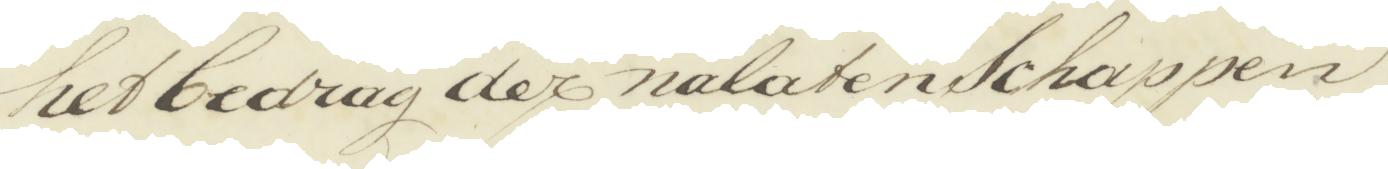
het bedrag der nalatenschappen
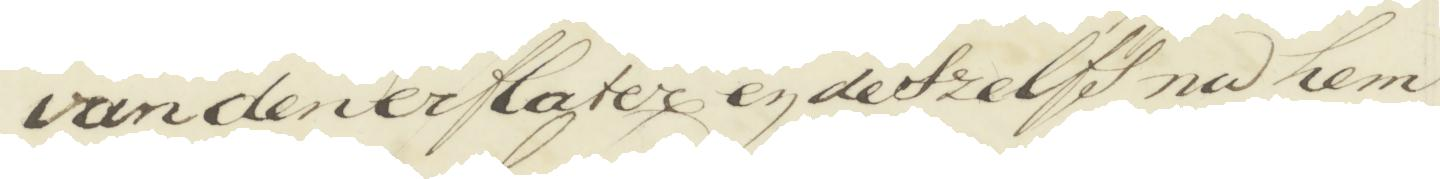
van den erflater en deszelfs na hem
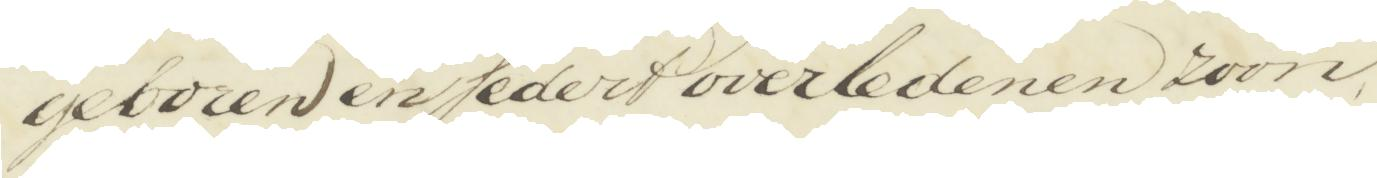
geboren en sedert overledenen zoon
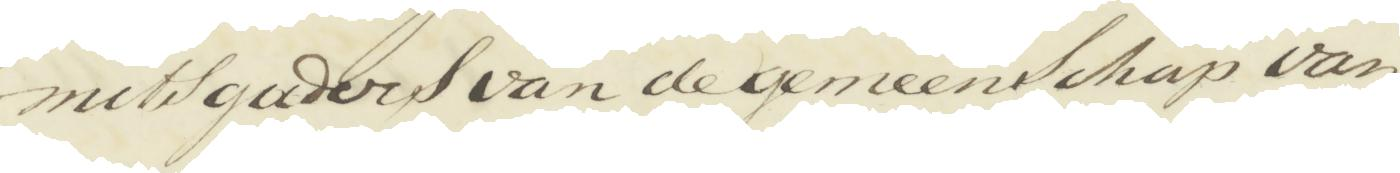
mitsgaders van de gemeenschap van
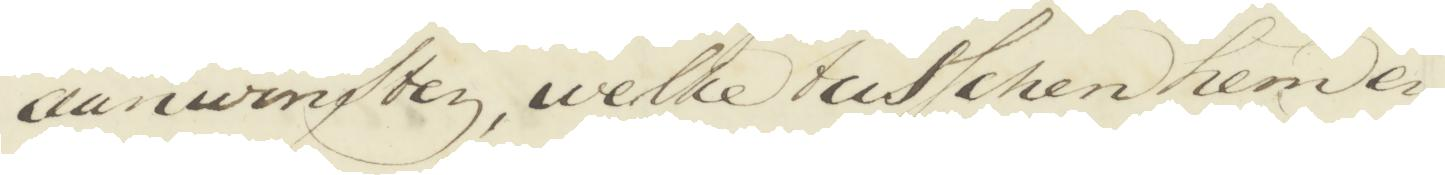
aanwinsten, welke tusschen hem en
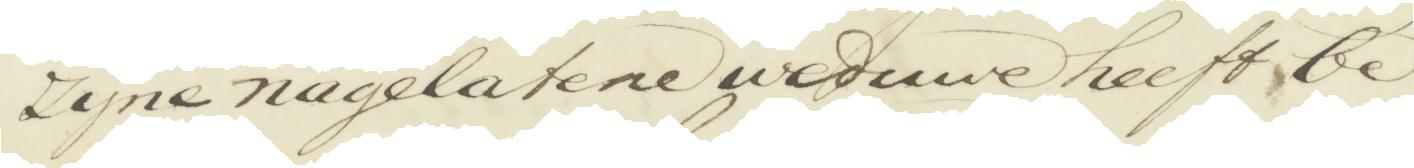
zyne nagelatene weduwe heeft, be
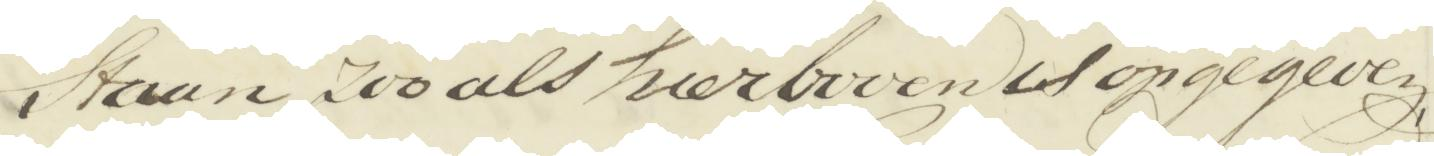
staan zoo als hierboven is opgegeven,
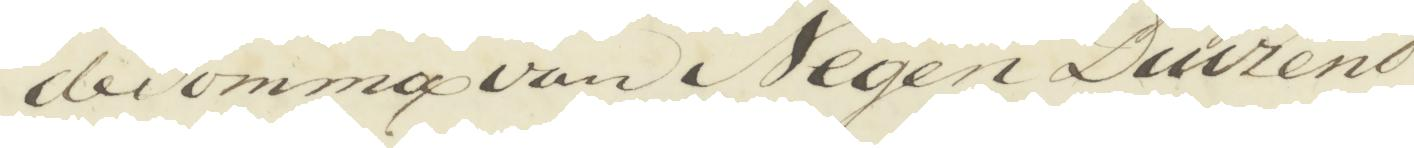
de somma van Negen Duizend
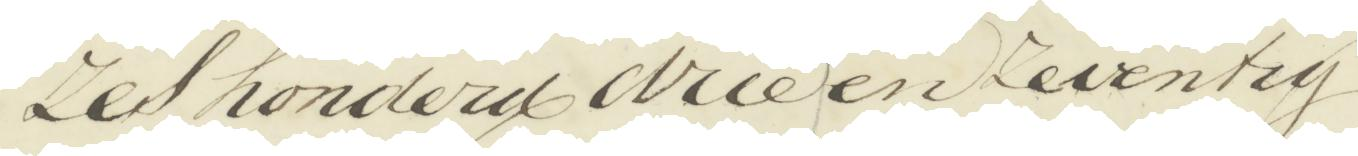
Zes honderd drie en zeventig
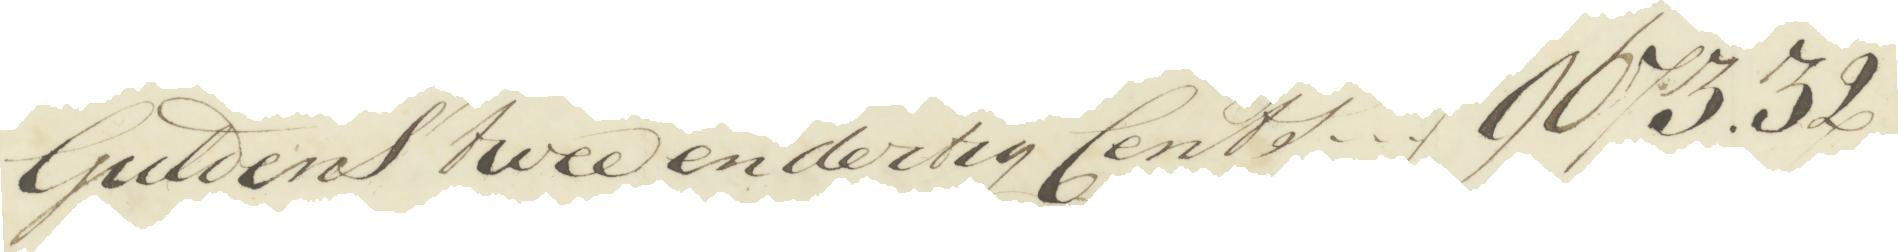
Guldens twee en dertig Cents. . . ƒ 9673:32
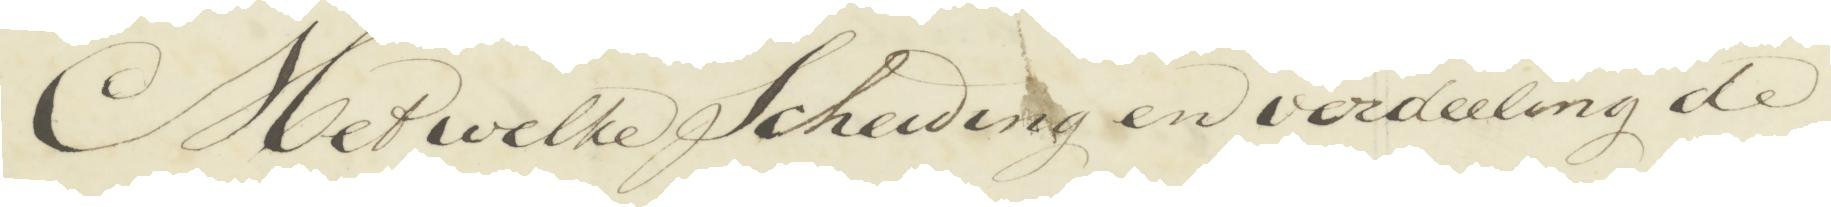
Met welke Scheiding en verdeeling de
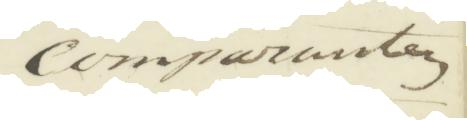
comparanten
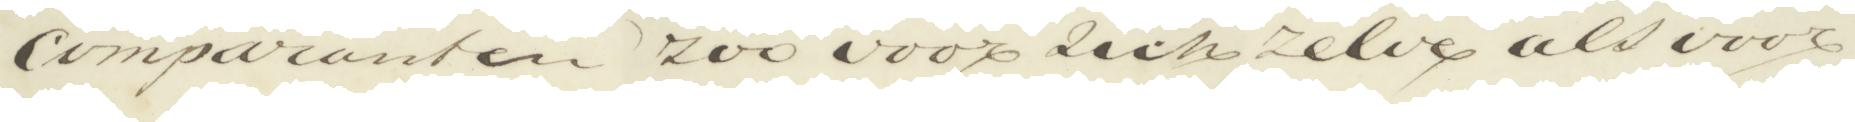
Comparanten zoo voor zich zelve als voor
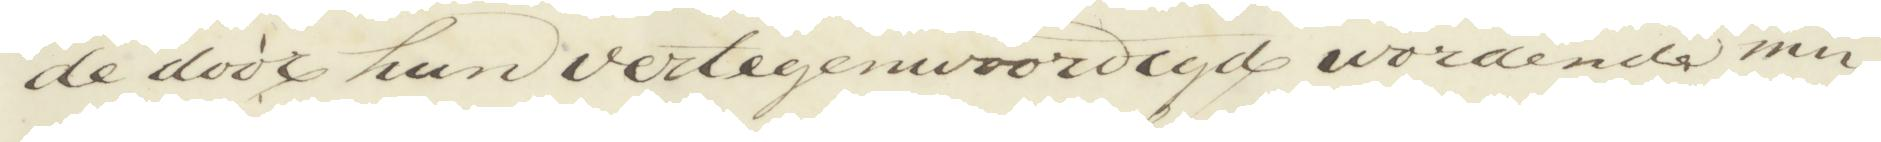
de door hun vertegenwoordigd wordende min,
